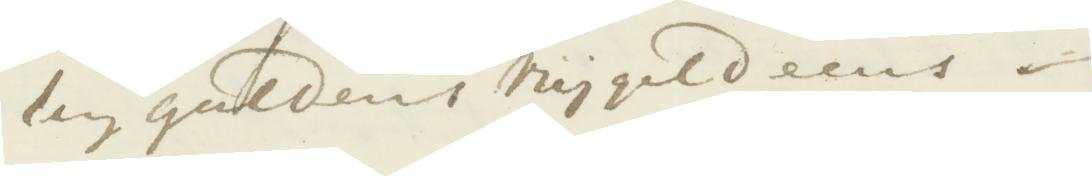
Een guldens vrij geld eens
